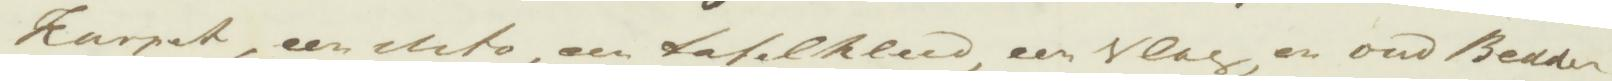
karpet, een dito, een tafelkleed, een vlag, en oud Bedde
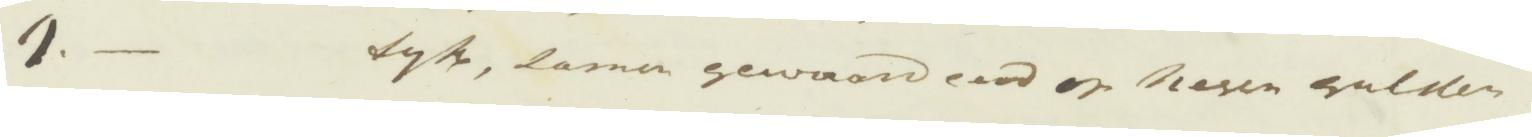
9. — tyk, zamen gewaardeerd op negen gulden
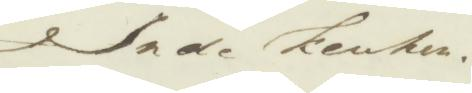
In de keuken
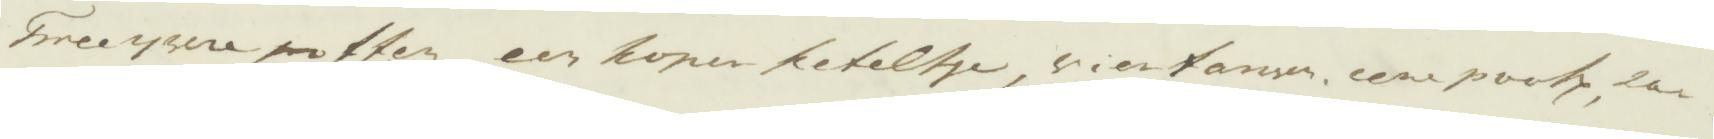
Twee ysere potten, een koper keteltje, vier tangen, eene pook, za
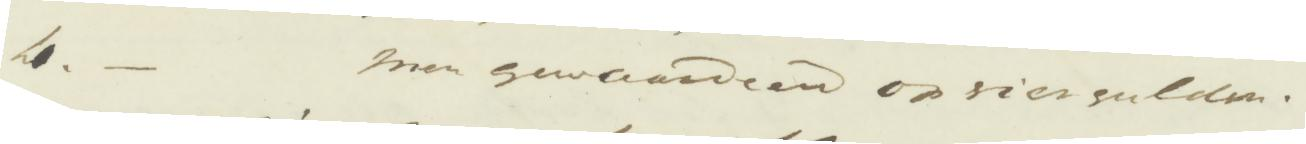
4. — men gewaardeerd op vier gulden.
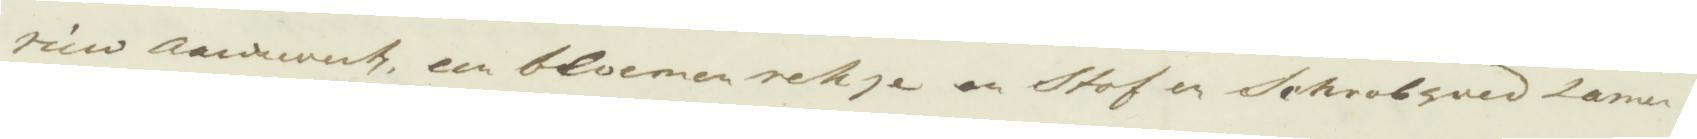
ruw aardewerk, een bloemen rekje en stof en schrobgoed zamen
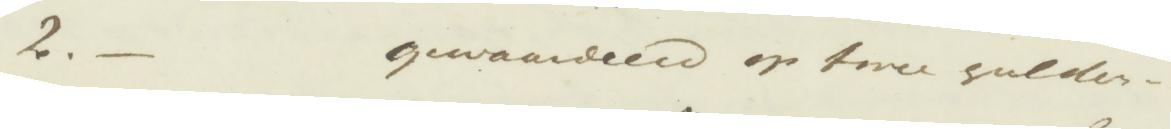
2. — gewaardeerd op twee gulden -
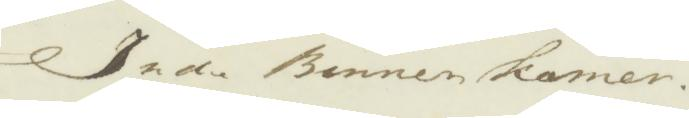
In de Binnen kamer
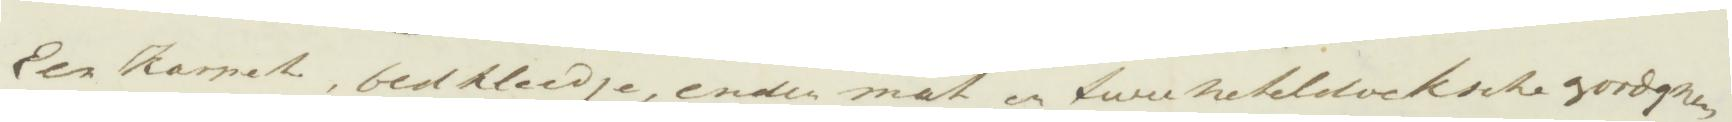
Een karpet, bedkleedje, onder mat en twee keteldoeksche gordynen
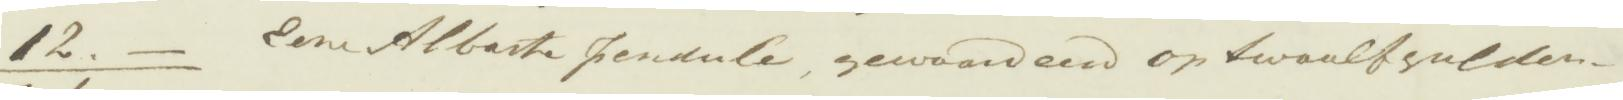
12. — Eene Albaste pendule, gewaardeerd op twaalf gulden.
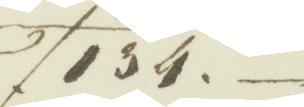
ƒ134. —
